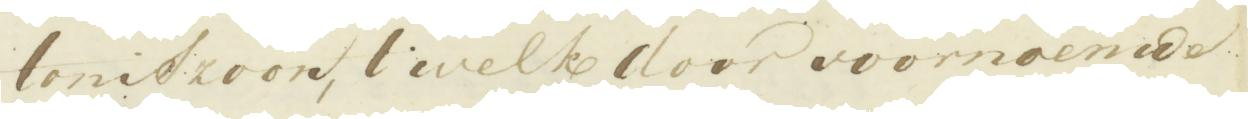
toniszoon, twelk door voornoemde
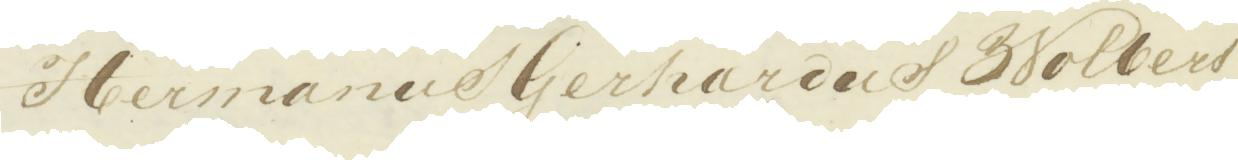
Hermanus Gerhardus Wolbers
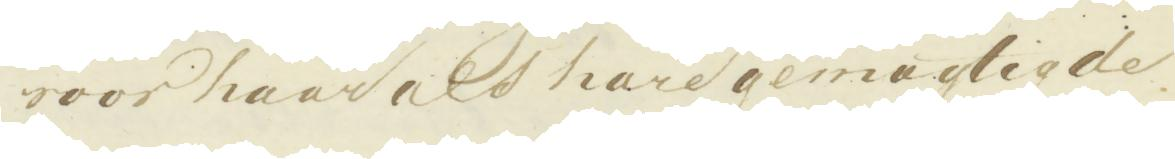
voor haar als hare gemagtigde
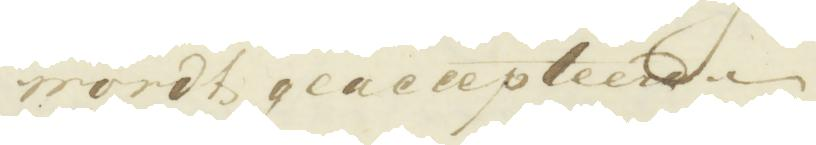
wordt geaccepteerd.—
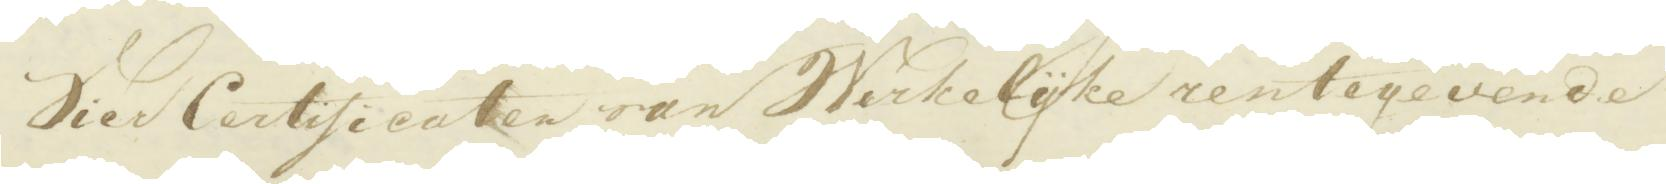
Vier Certificaten van Werkelijke rentegevende
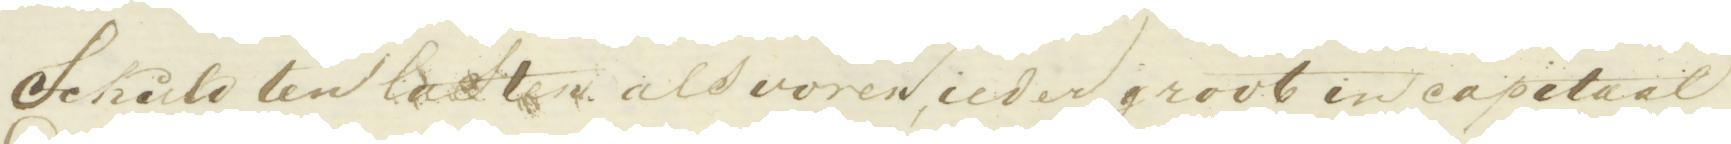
schuld ten lasten als voren, ieder groot in capitaal
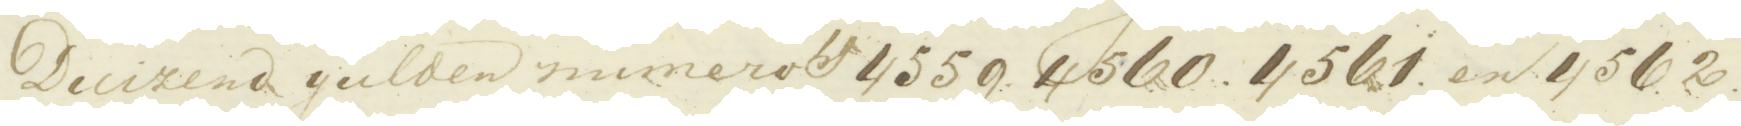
Duizend gulden numero's 4559. 4560. 4561. en 4562.
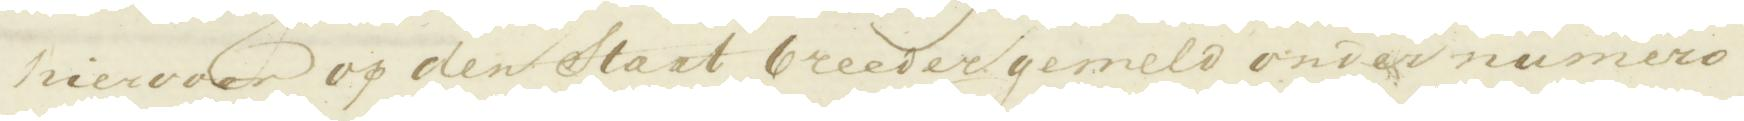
hier voor op den staat breedergemeld onder numero
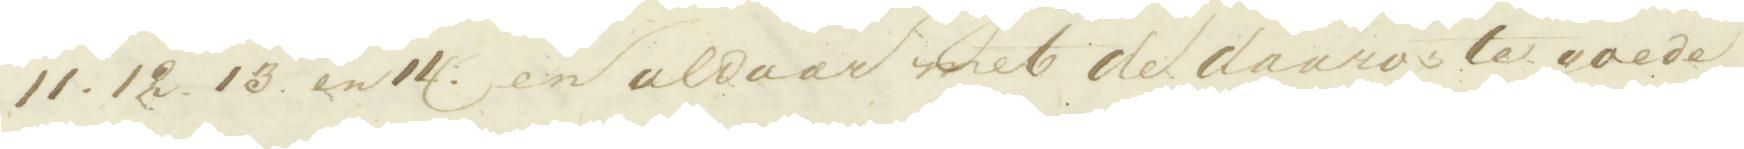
11. 12. 13. en 14: en aldaar met de daarop te goede
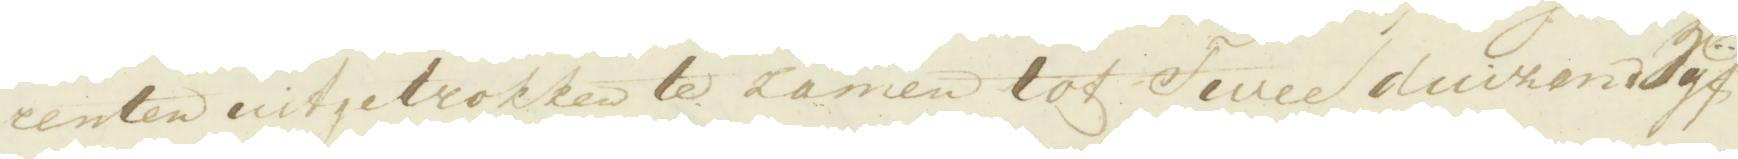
renten uitgetrokken te zamen tot Twee duizend Vijf,
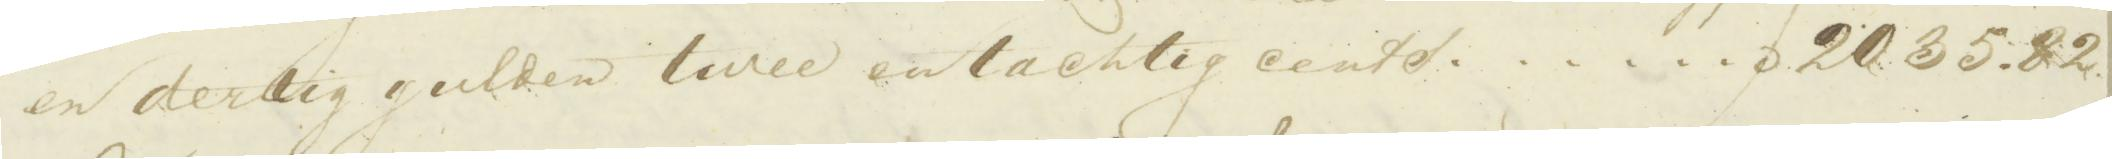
en dertig gulden twee en tachtig cents. . . . . . ƒ2035:82.
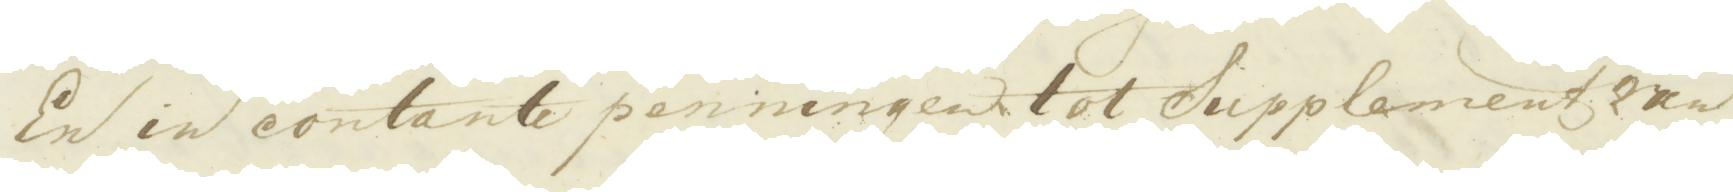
En in contante penningen tot supplement van
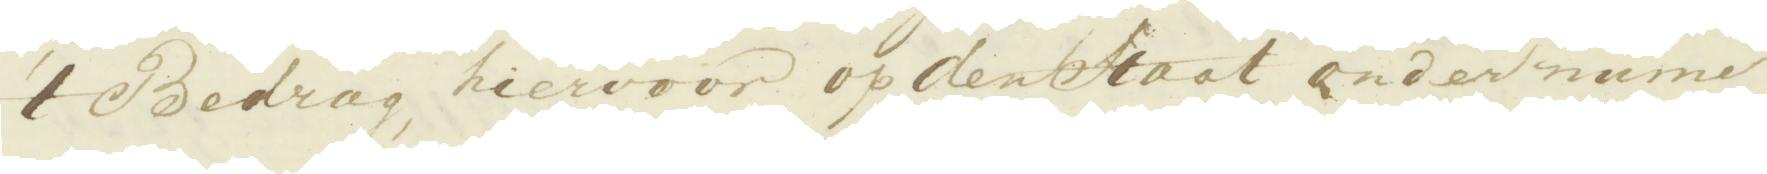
’t Bedrag hiervoor op den staat onder nume
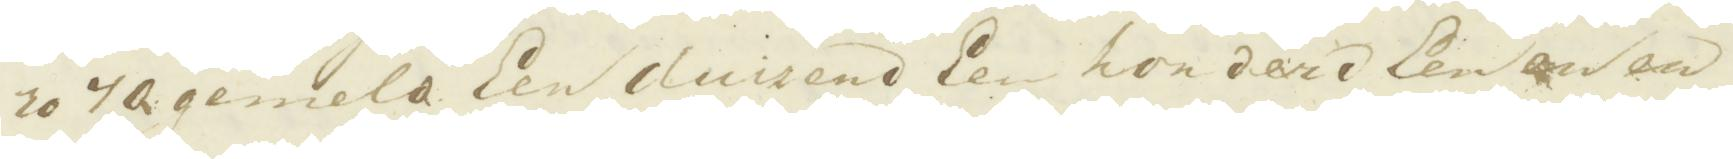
ro 70 gemeld Een duizend Een honderd Een en en
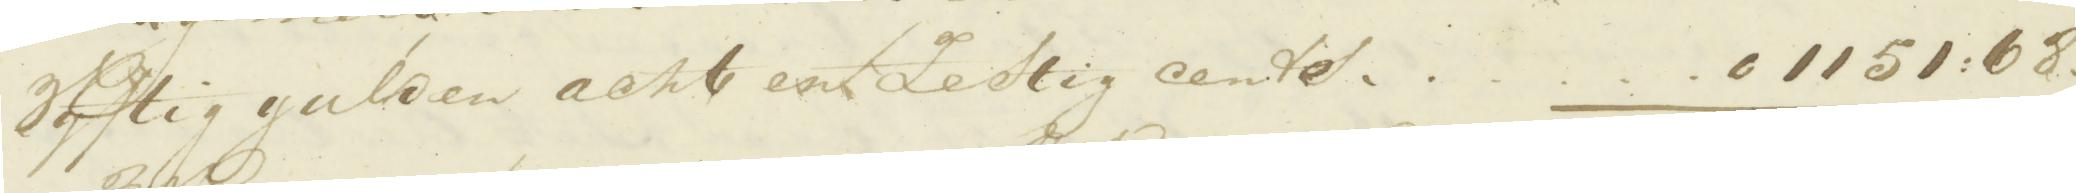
Vyftig gulden acht en Zestig cents. . . . . . „ 1151:68.
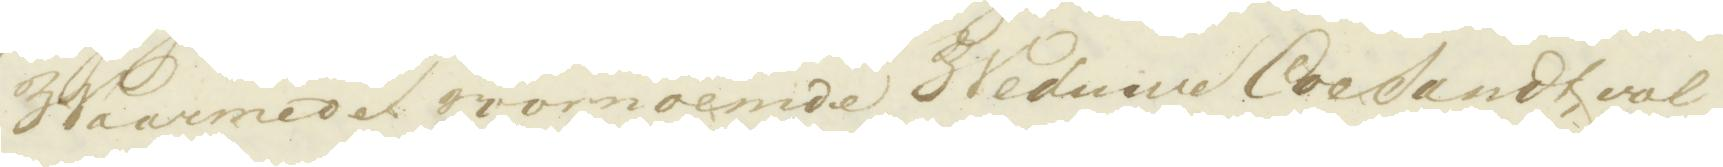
Waarmede voornoemde Weduwe Coesandt, vol
